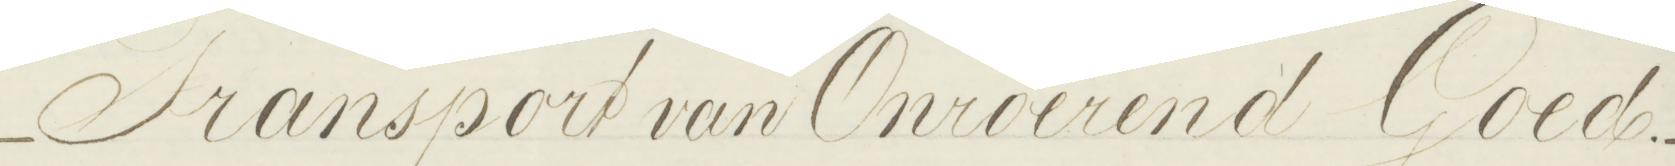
Transport van Onroerend Goed.
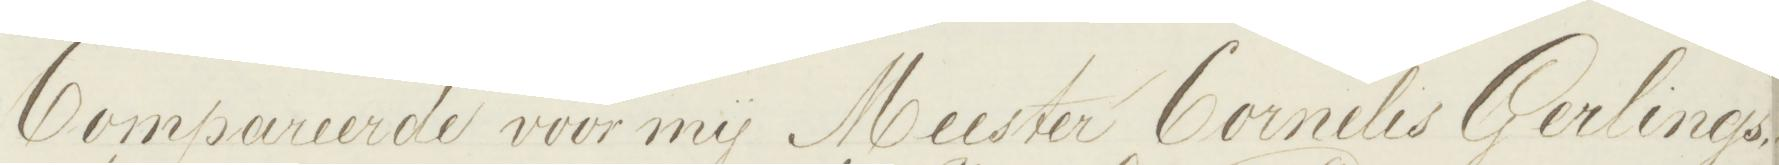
Compareerde voor mij Meester Cornelis Gerlings,
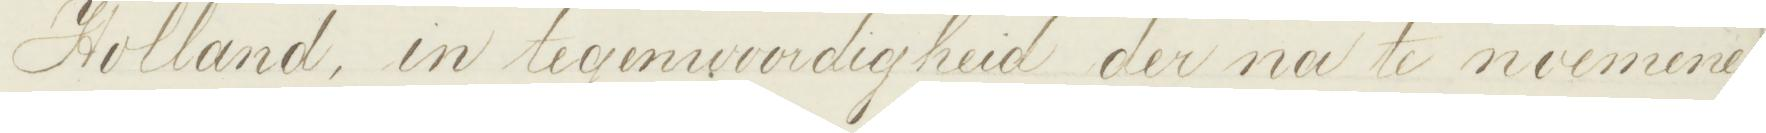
Holland, in tegenwoordigheid der na te noemene
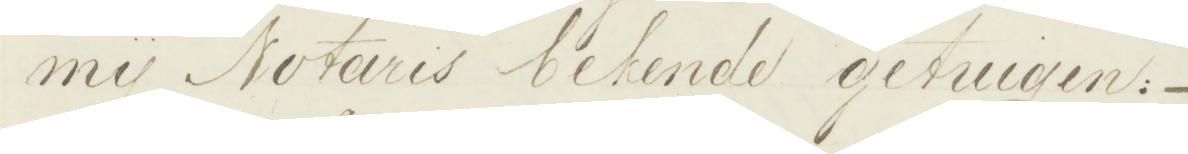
mij Notaris bekende getuigen:
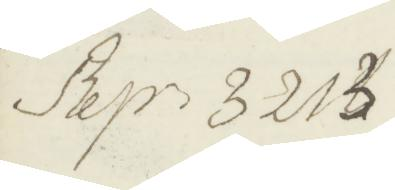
Rep: 3213
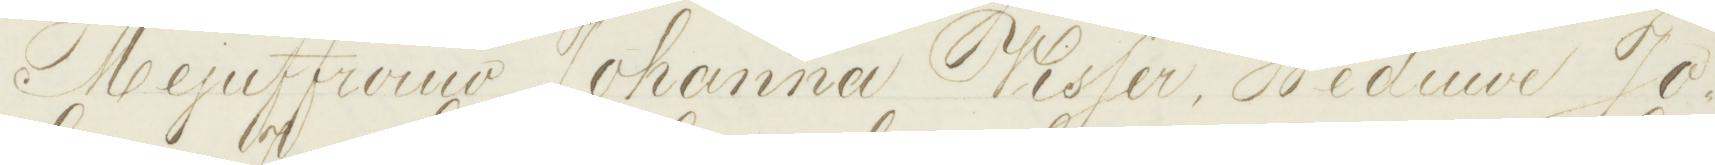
Mejuffrouw Johanna Visser, Weduwe Jo„
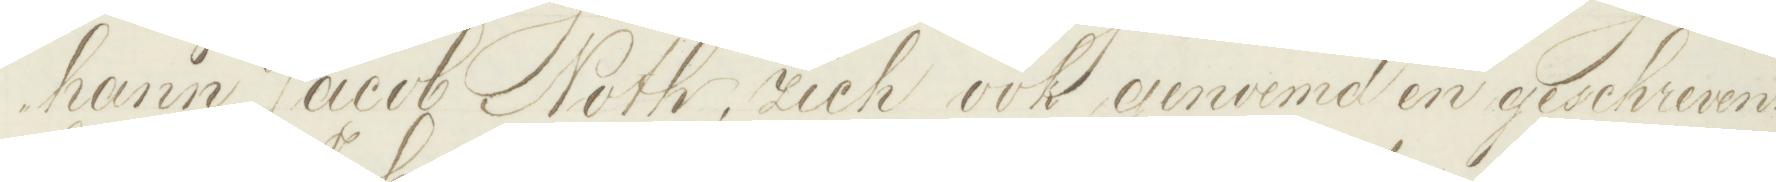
hann Jacob Noth, zich ook genoemd en geschreven
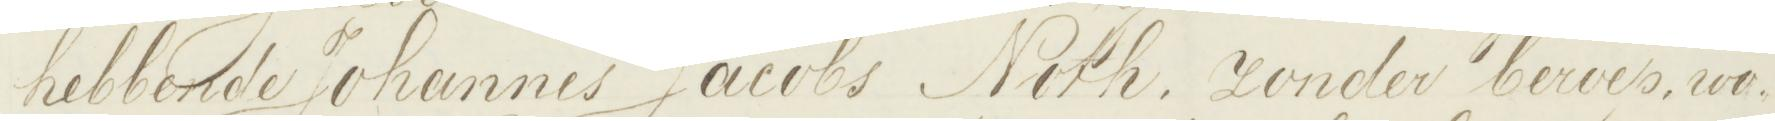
hebbende Johannes Jacobs Noth, zonder beroep, wo
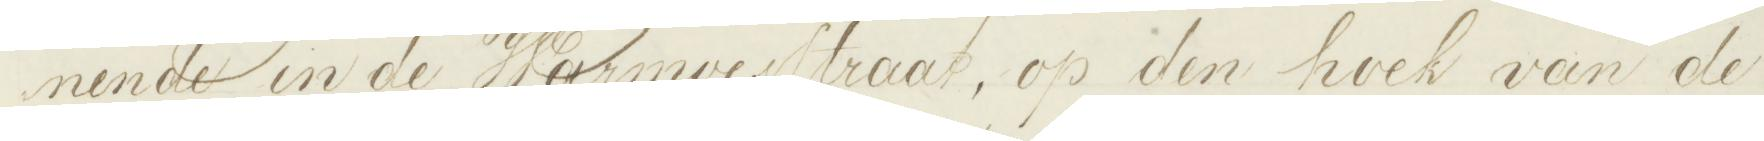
nende in de Warmoesstraat, op den hoek van de
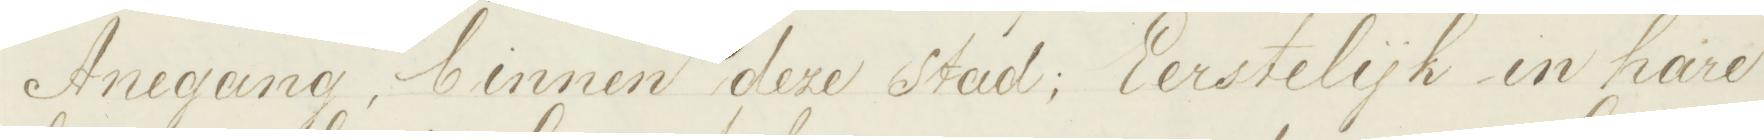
Anegang, binnen deze stad; Eerstelijk in hare
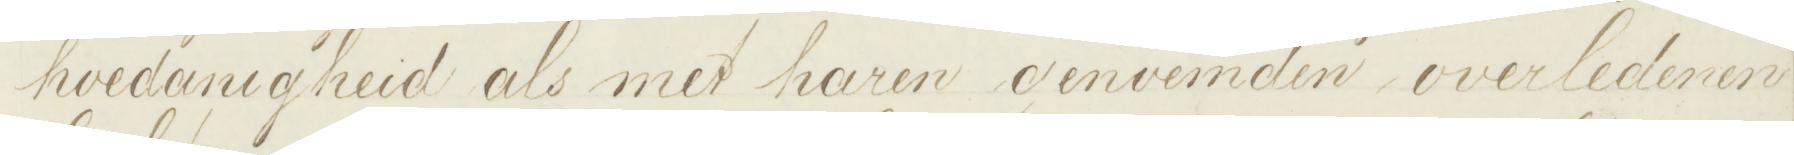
hoedanigheid als met haren genoemden, overledenen
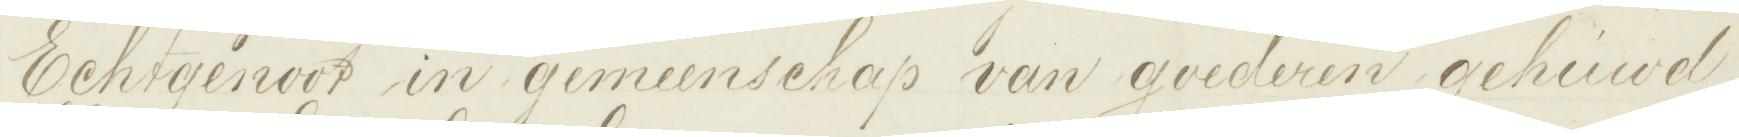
Echtgenoot in gemeenschap van goederen gehuwd
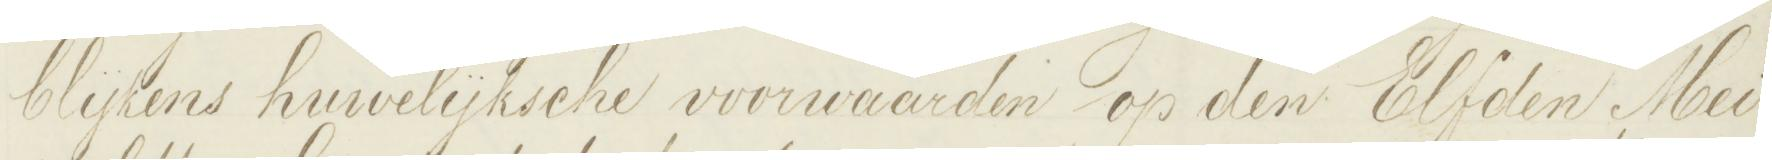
blijkens huwelijksche voorwaarden op den Elfden Mei
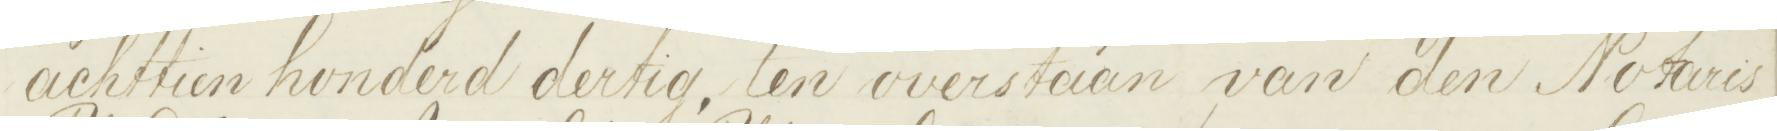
achttien honderd dertig, ten overstaan van den Notaris
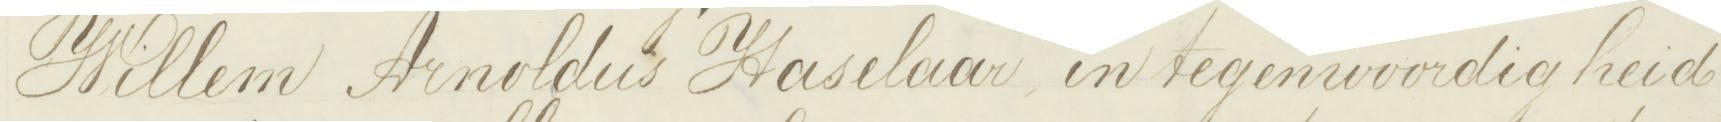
Willem Arnoldus Haselaar, in tegenwoordigheid
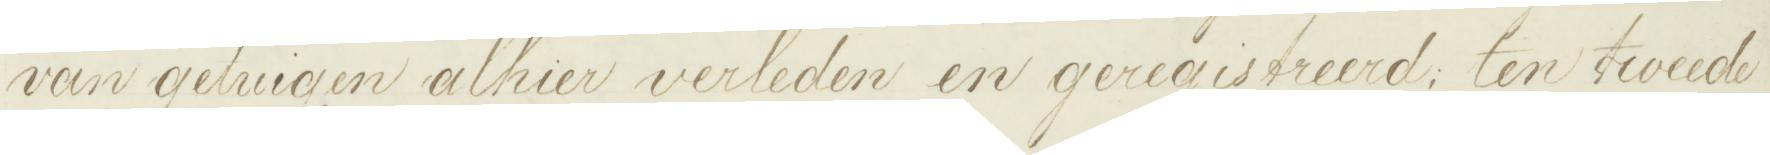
van getuigen alhier verleden en geregistreerd; ten tweede
